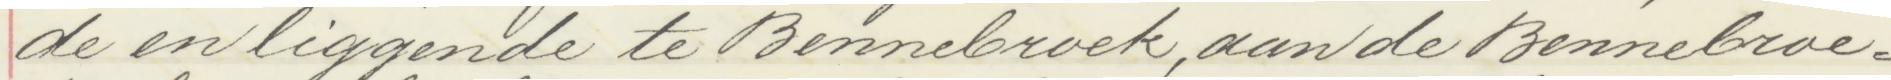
de en liggende te Bennebroek, aan de Bennebroe=
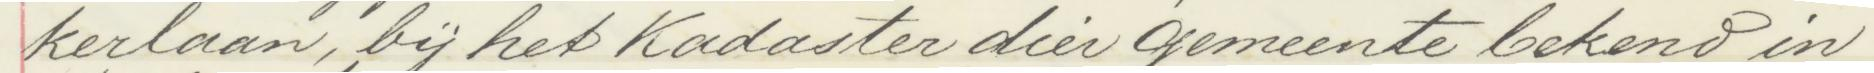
kerlaan, bij het Kadaster dier gemeente bekend in
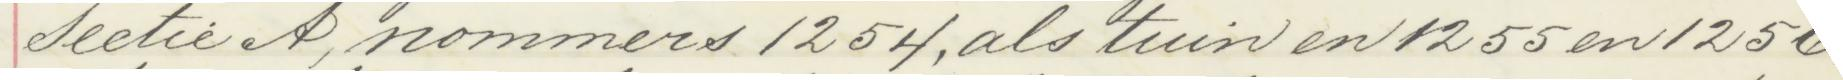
sectie A, nommers 1254, als tuin en 1255 en 1256,
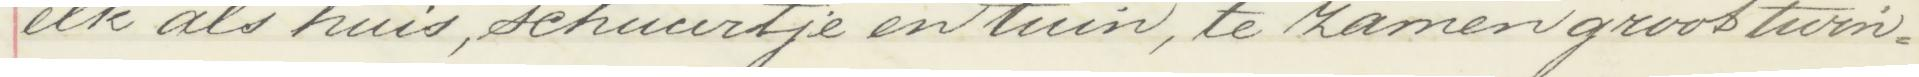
elk als huis, schuurtje en tuin, te zamen groot twin=
